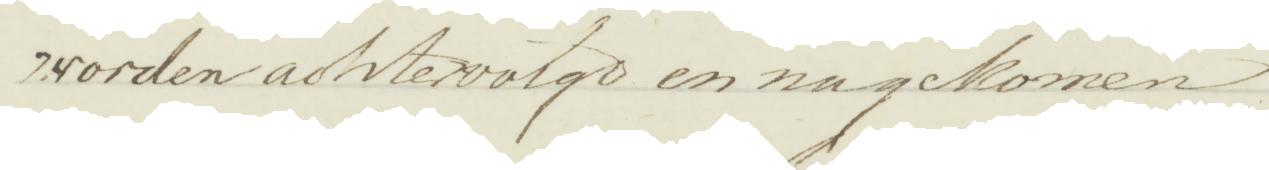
worden achtervolgd en nagekomen
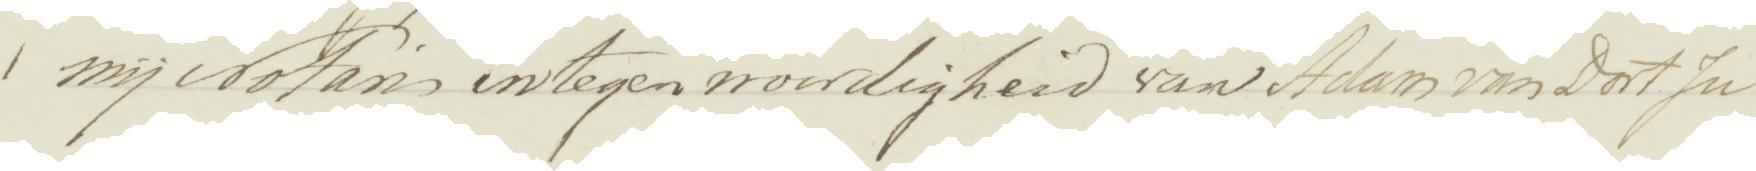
mij Notaris in tegen woordigheid van Adam van Dort Ju
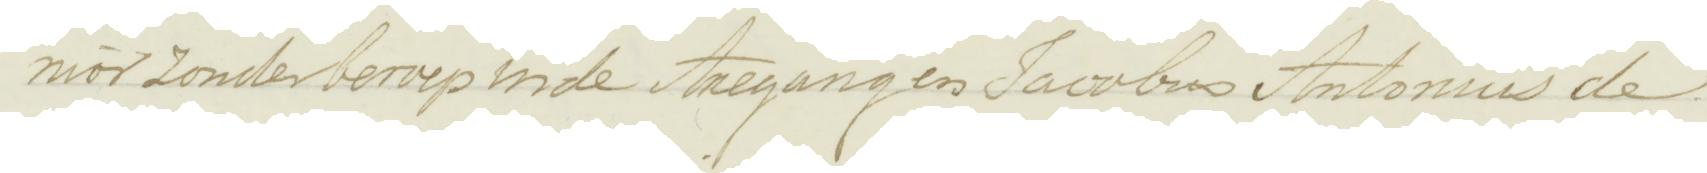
nior zonder beroep inde Anegang en Iacobus Antonius de
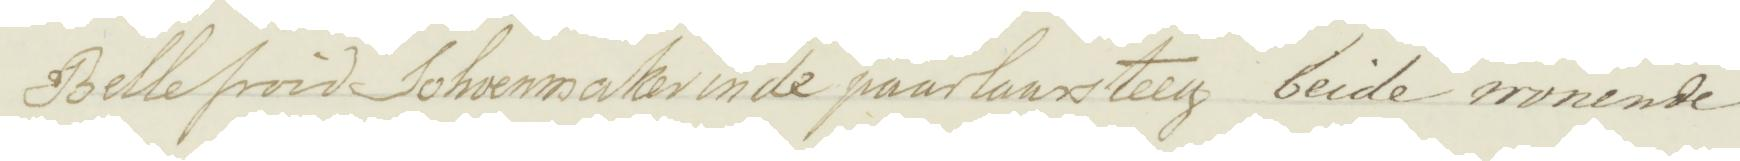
Bellefroid Schoenmaker in de paarlaarsteeg beide wonende
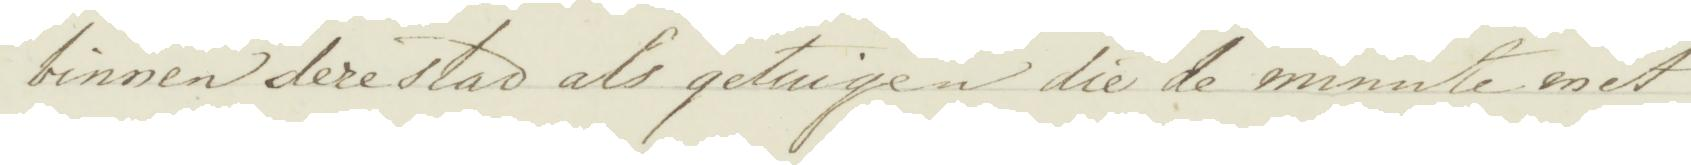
binnen deze stad als getuigen die de minute met
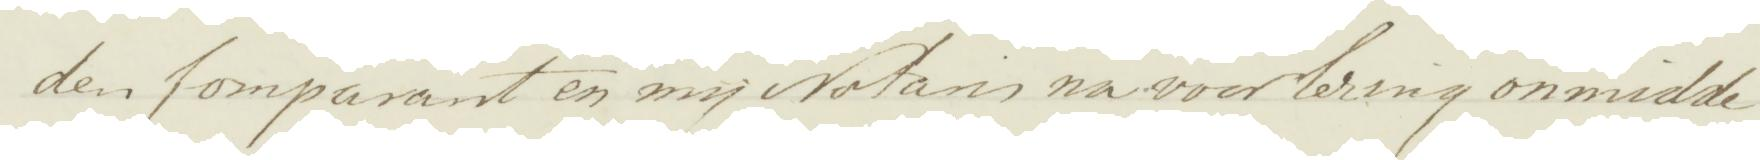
den Comparant en mij Notaris na voorlezing onmidde
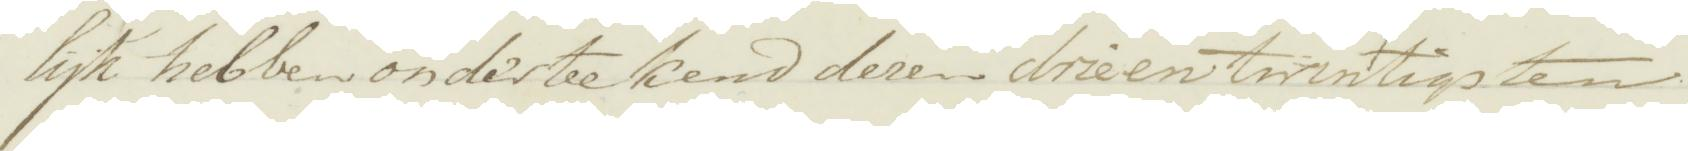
lijk hebben onderteekend dezen drie en twintigsten
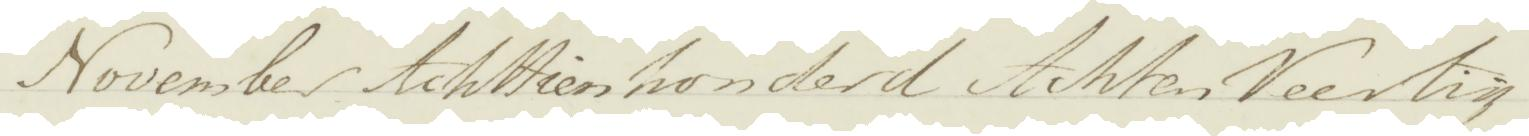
November Achttien honderd Acht en Veertig
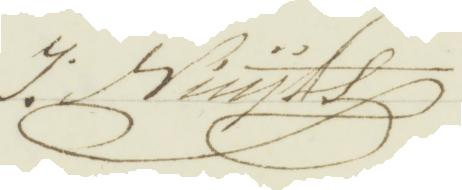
J: Nuijts
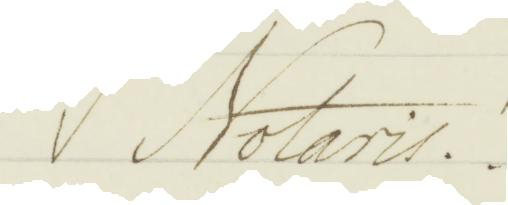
Notaris. .
